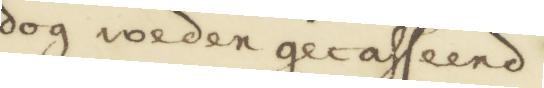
dog weder gecasseerd
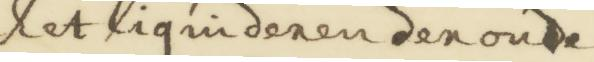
het liquideren der oude
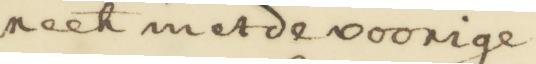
reek met de voorige
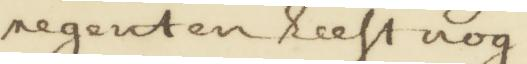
regenten heeft nog
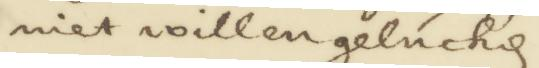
niet willen gelucken
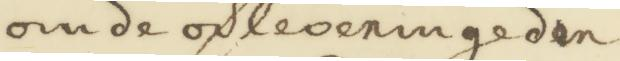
om de overleveringe der
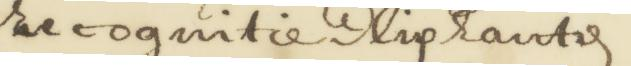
recognitie Eliphanten
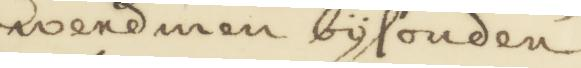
werd men bijsonder
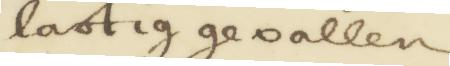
lastig gevallen
